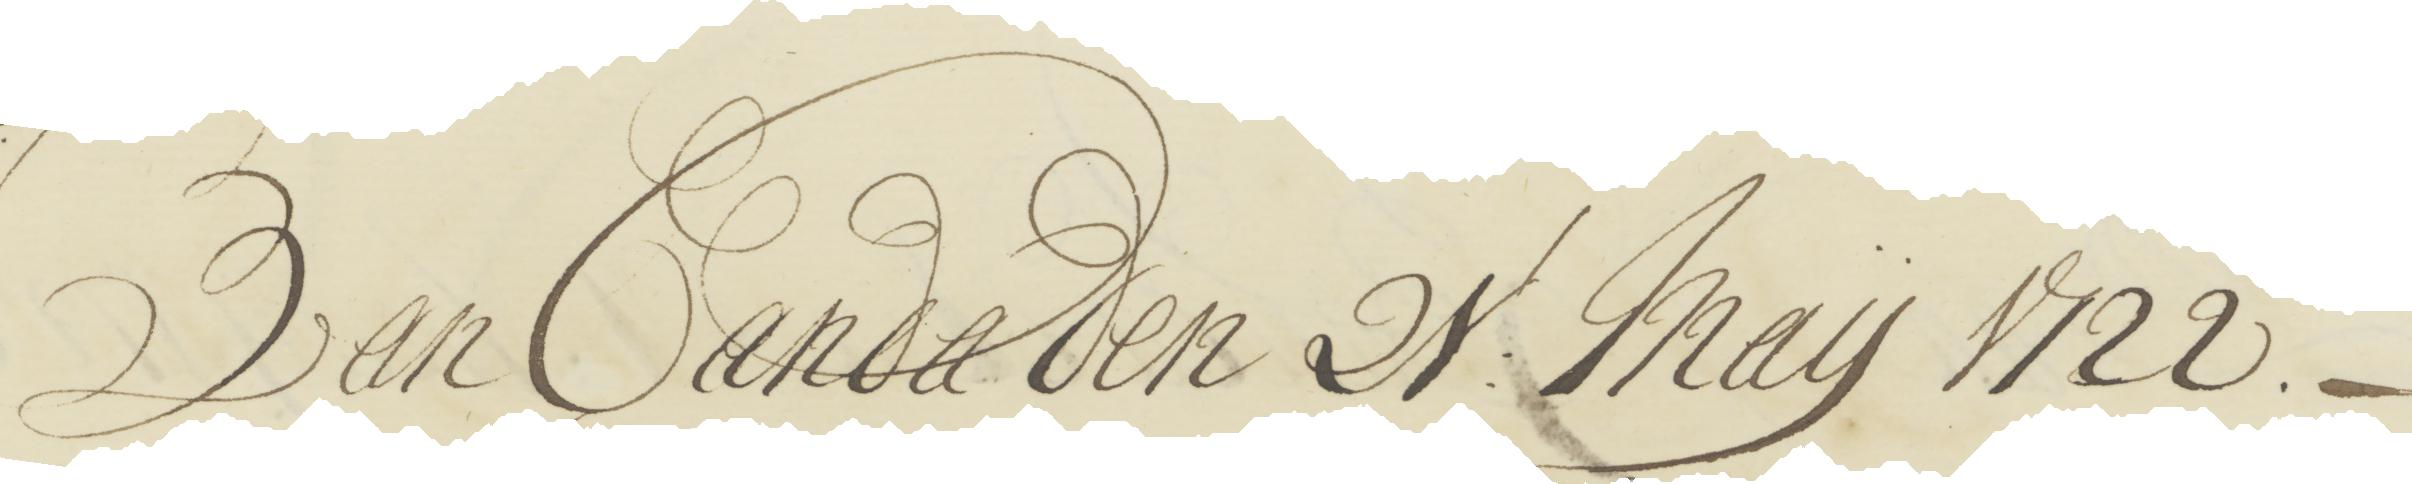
Van Banda den 21:' Maij 1722. —
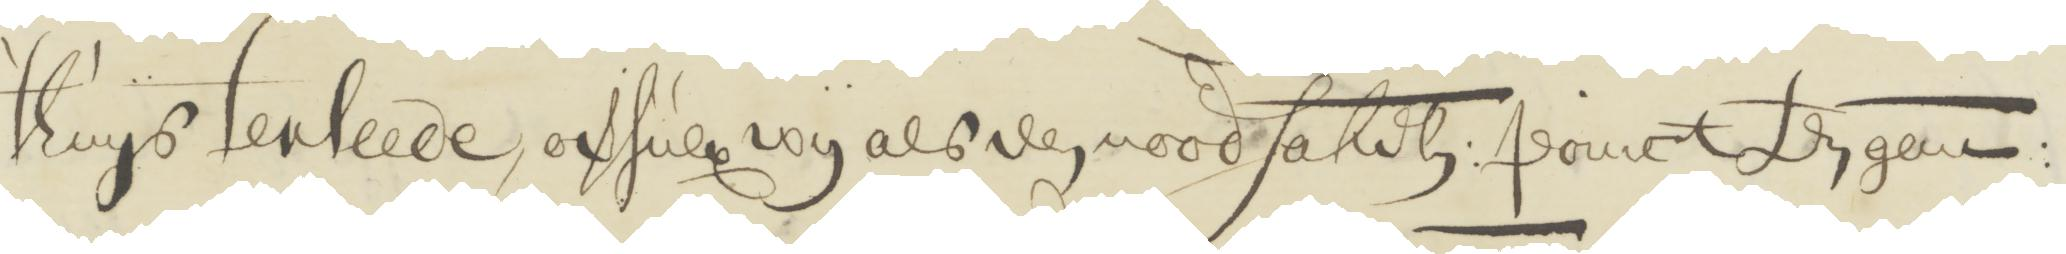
'thuijs ter leede, oversulx wij als een noodsakelijk poinct ten gem:
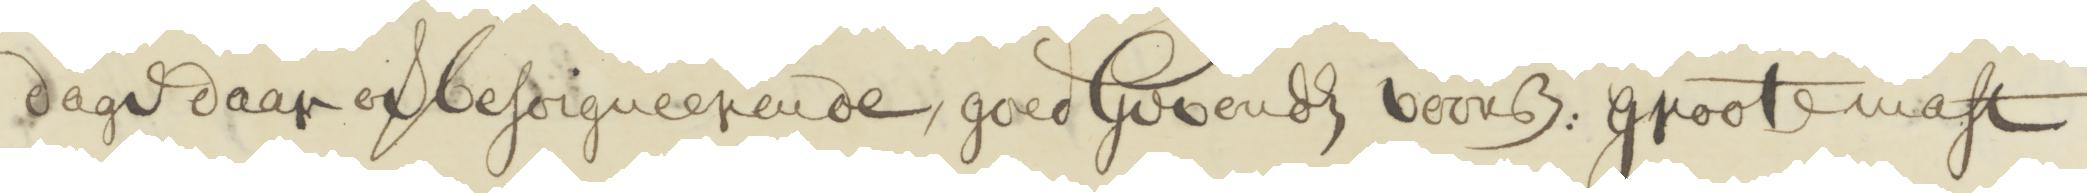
dage daar overbesoigneerende, goed Gevonden voorsz: groote mast
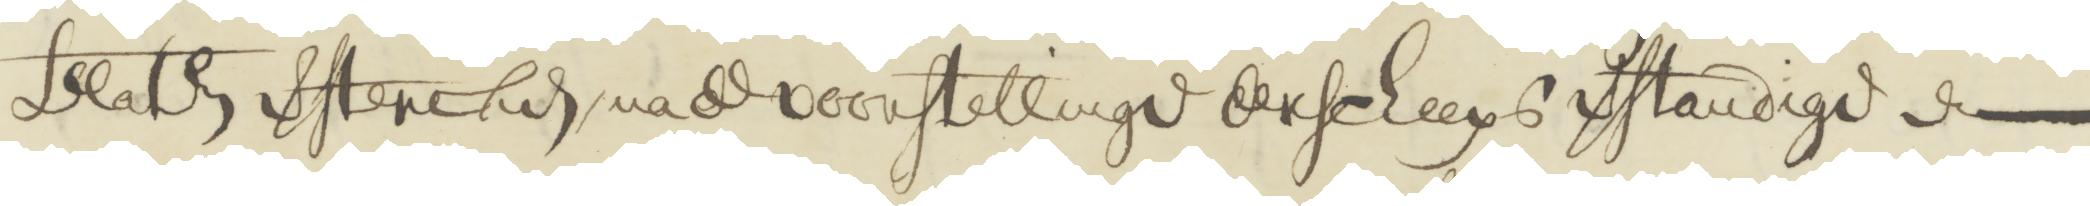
te laten verstercken, na de voorstellinge der scheeps verstandige en
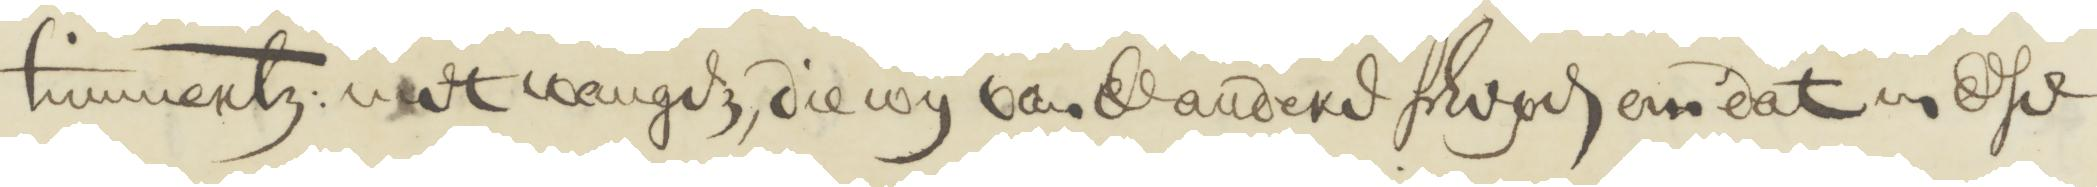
timmerlz: met wangen, die wij van de andere schepen om dat in dese
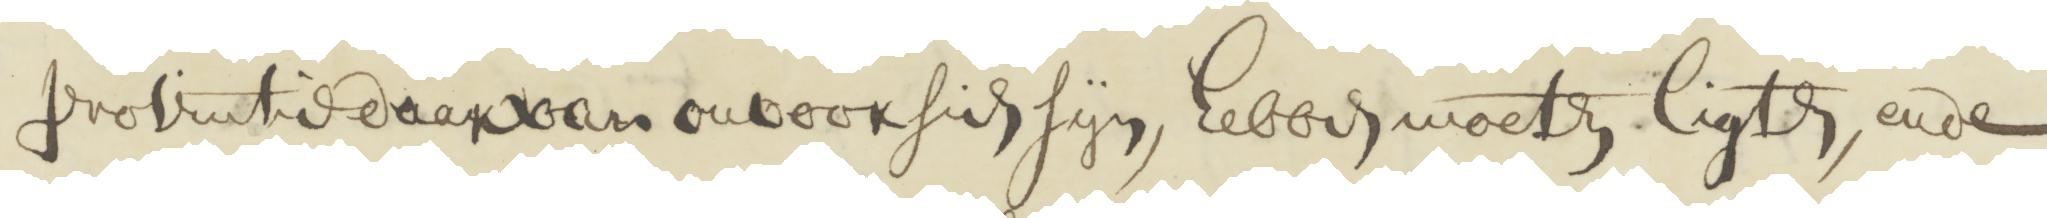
provintie daarvan onvoorsien sijn, hebben moeten ligten, ende
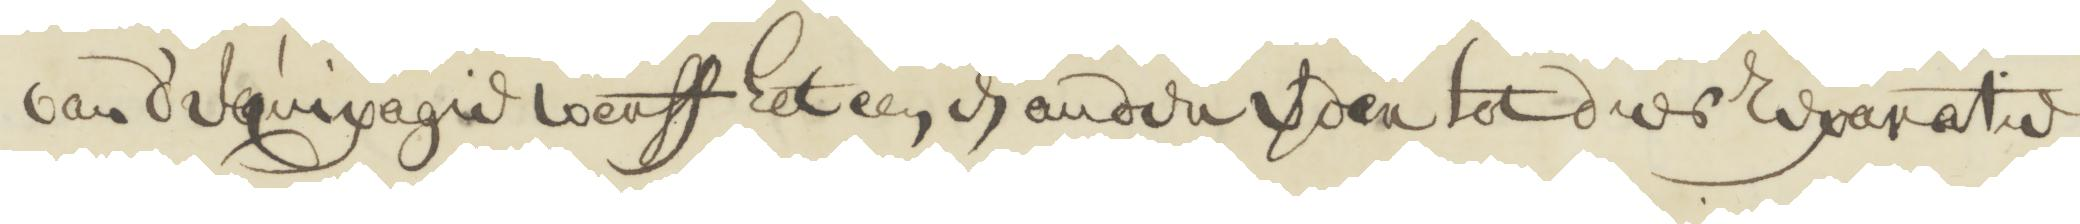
van d'Equipagie werff het een en ander verder tot dies reparatie
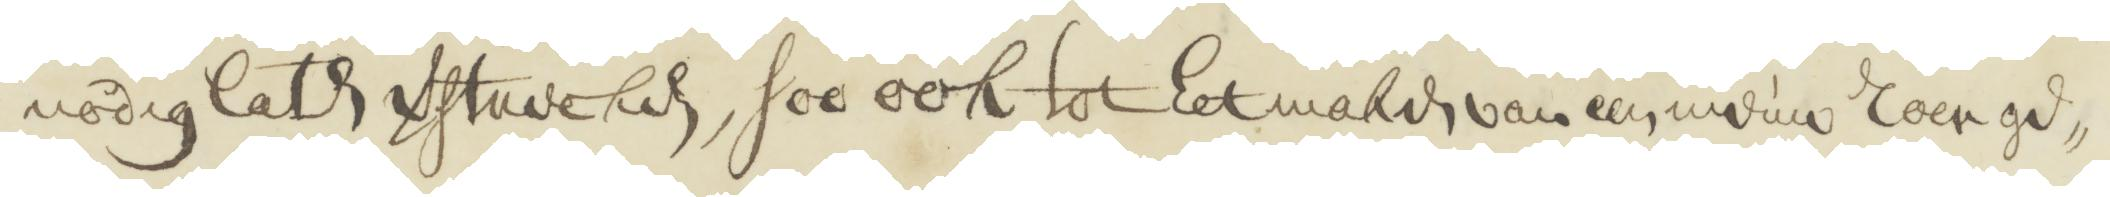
nodig laten verstrecken, soo ook tot het maken van een nieuw roer ge„
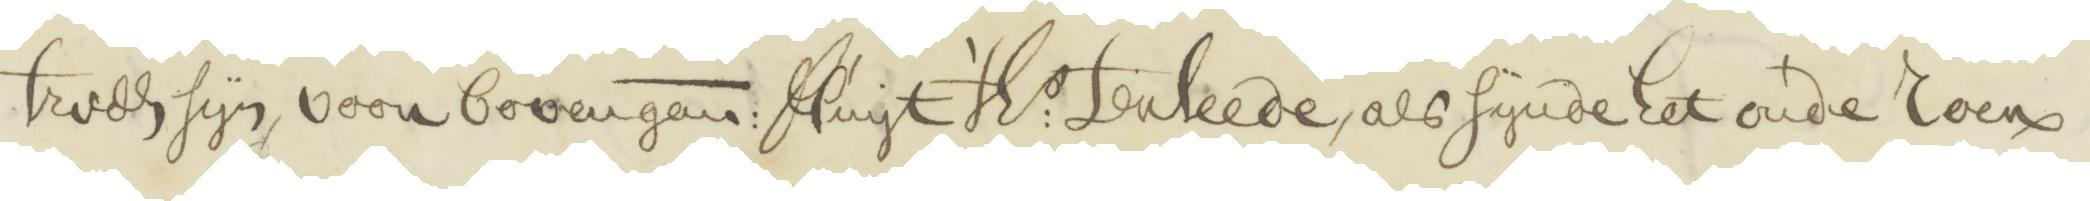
treden sijn, voor boven gem: fluijt 'th:s terleede, als sijnde het oude roer
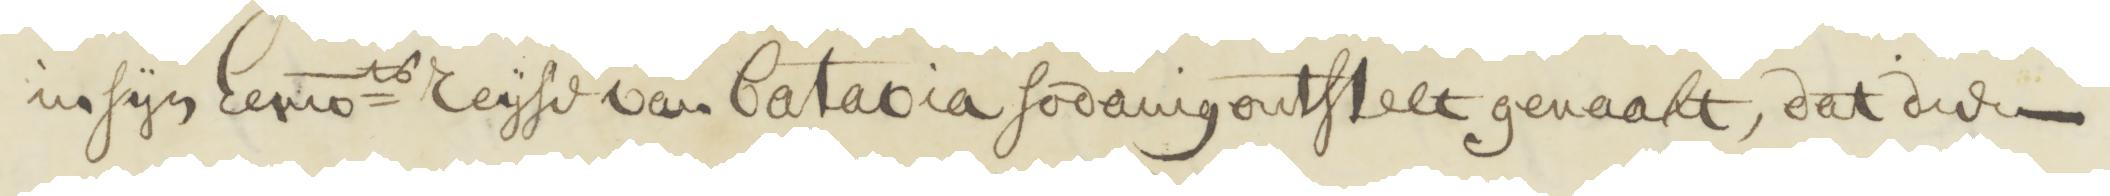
in sijn herw=ts reijse van batavia sodanig ontstelt geraakt, dat dien
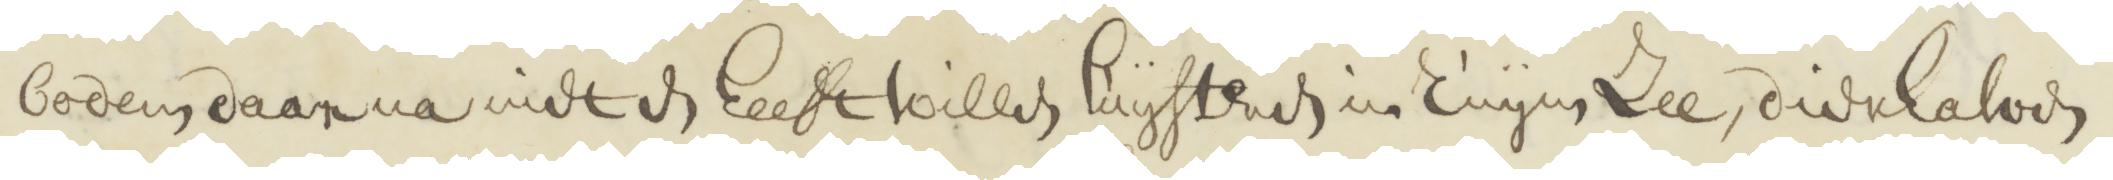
bodem daar na niet en heeft willen luijsteren in ruijm zee, dierhalven
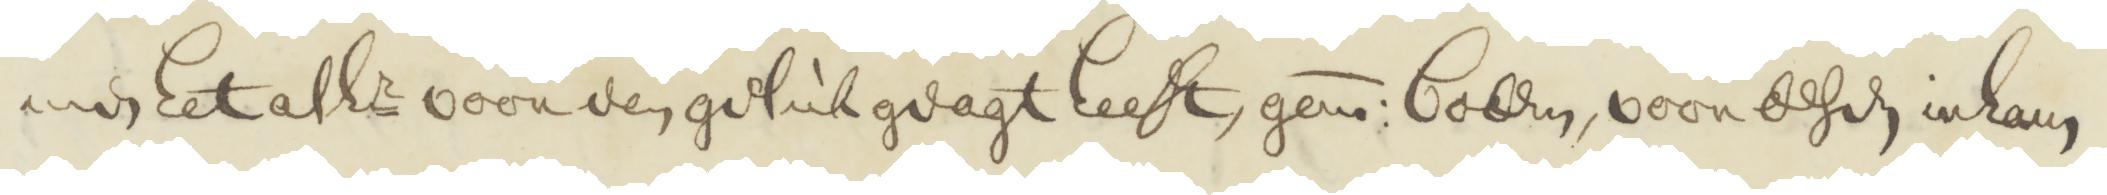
men het alh=r voor een geluk geagt heeft, gem: bodem, voor desen inham
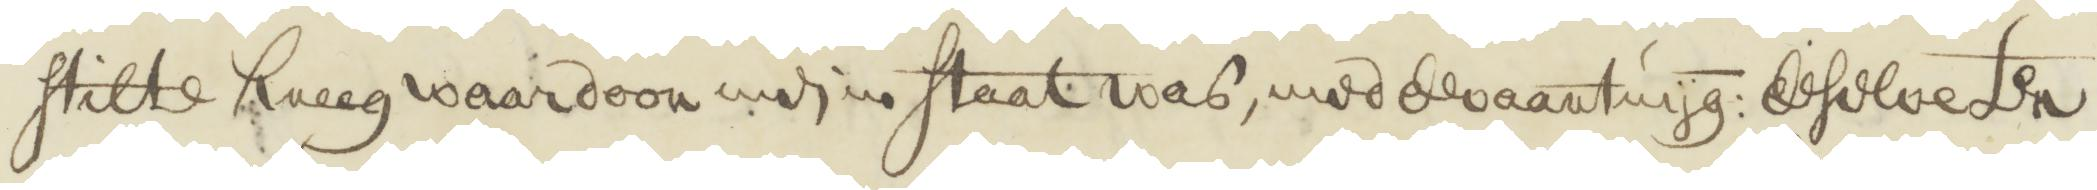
stilte kreeg waardoor men in staat was, med de vaartuijg: deselve ter
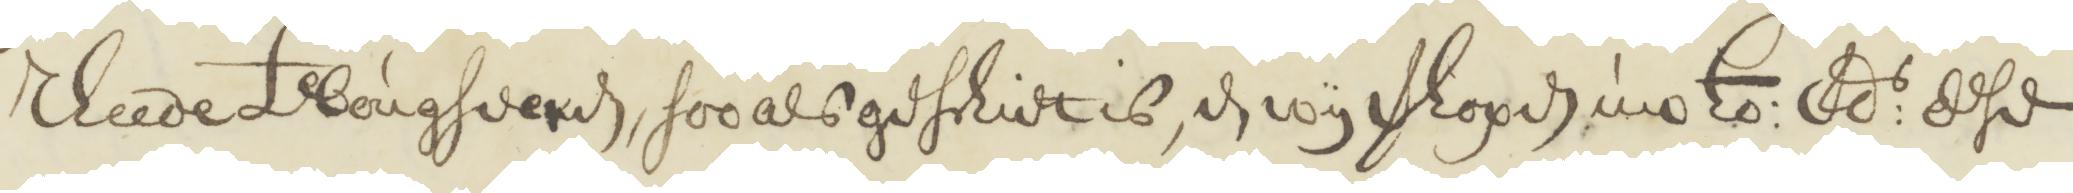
rheede te bougseeren, soo als geschiet is, en wij verhopen uw ho: Ed:s dese
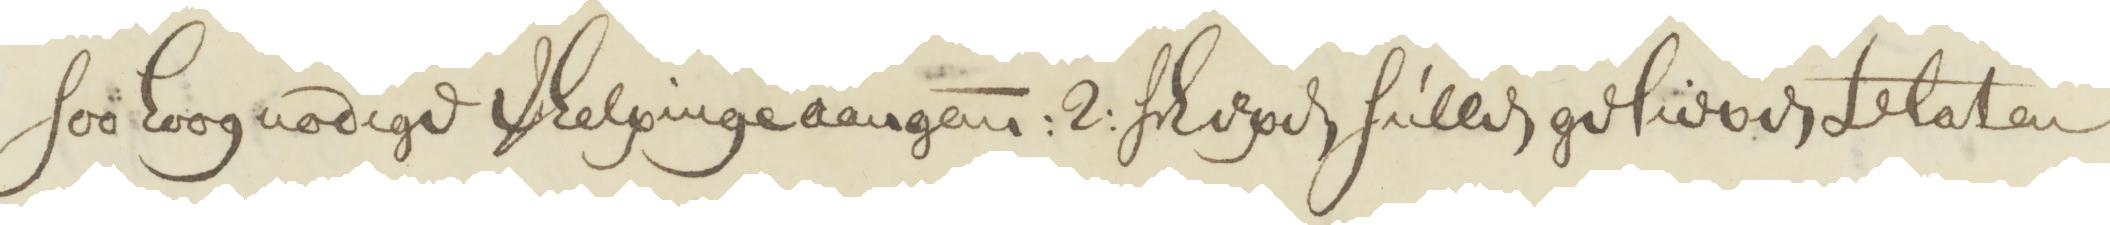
soo hoog nodige verhelpinge aan gem: 2: schepen sullen gelieven telaten
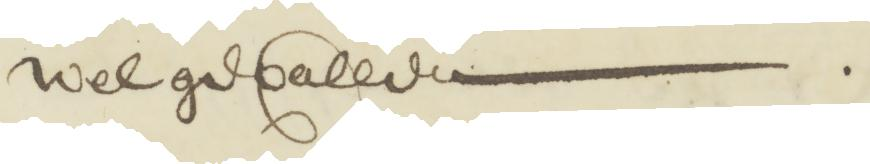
wel gevallen.
